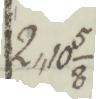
2„10 5/8
